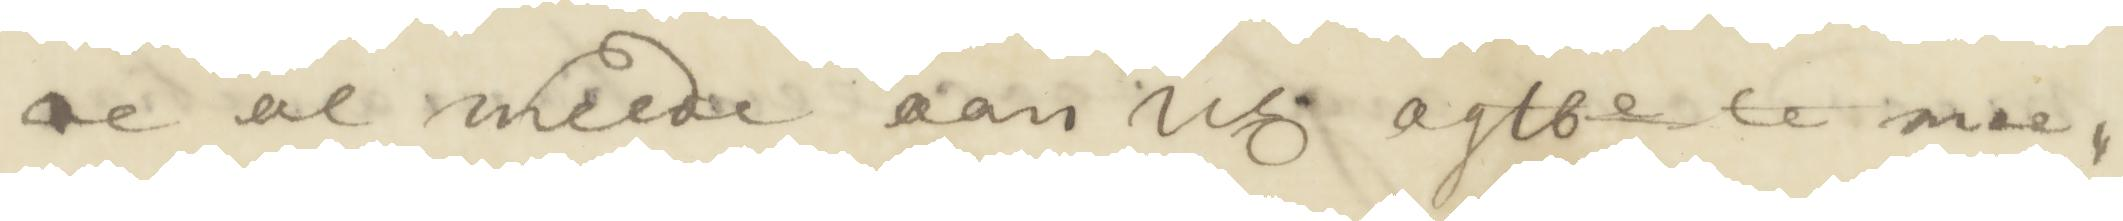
ve al meede aan uE agtb=e te moe„
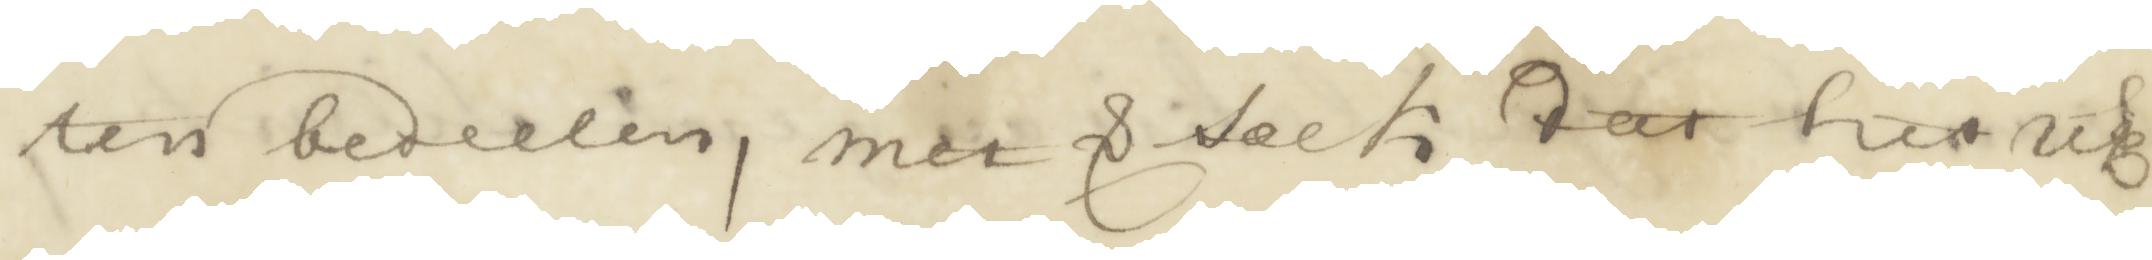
ten bedeelen, met versoek dat het uE
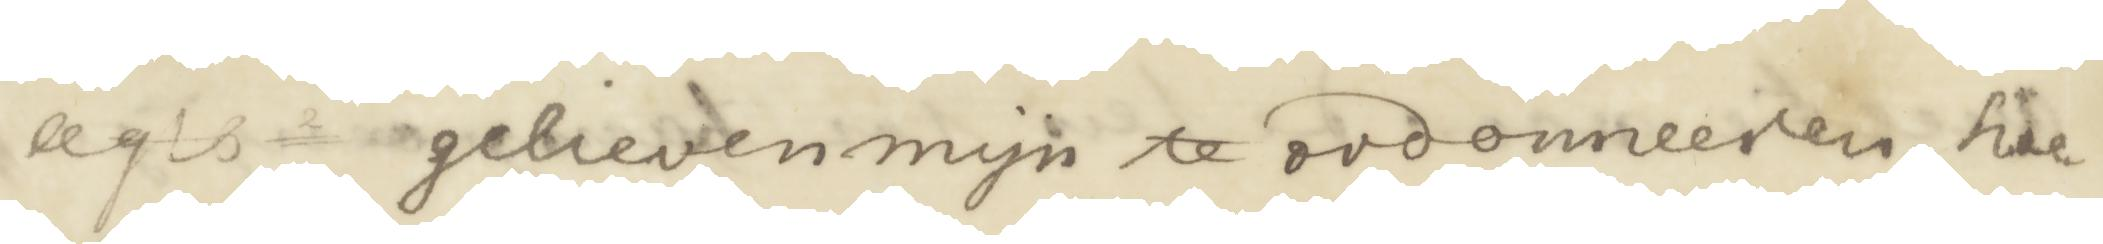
agtb gelieven mijn te ordonneeren, hoe
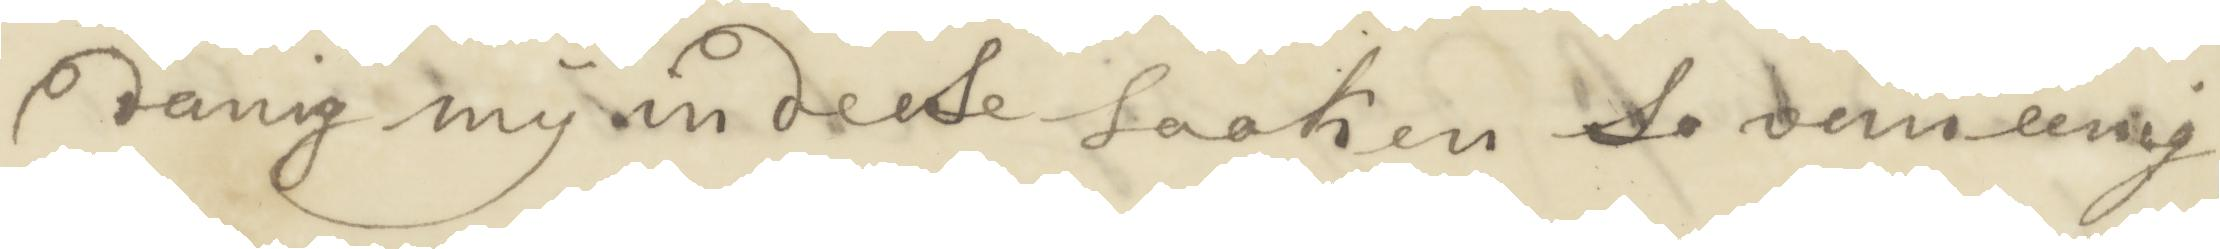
danig mij in deese saaken so van eenig
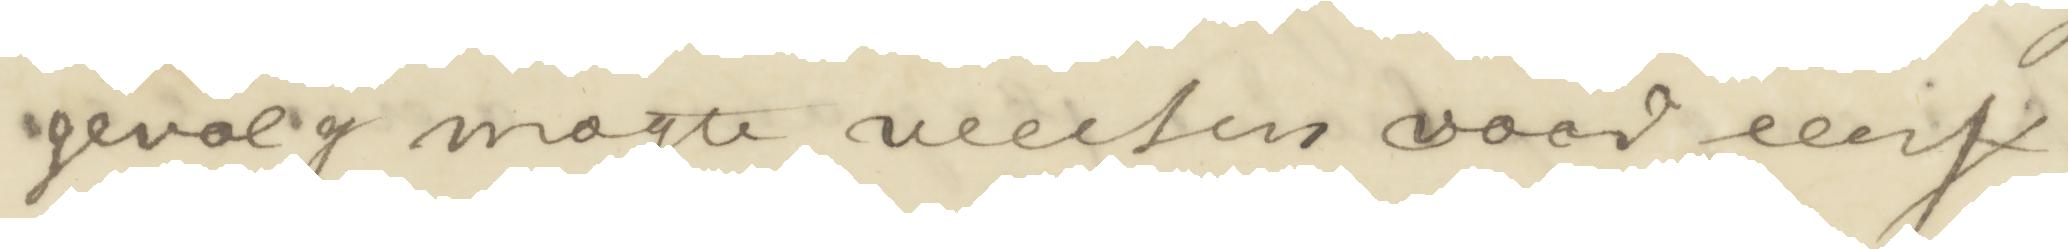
gevolg mogte weesen voor eerst
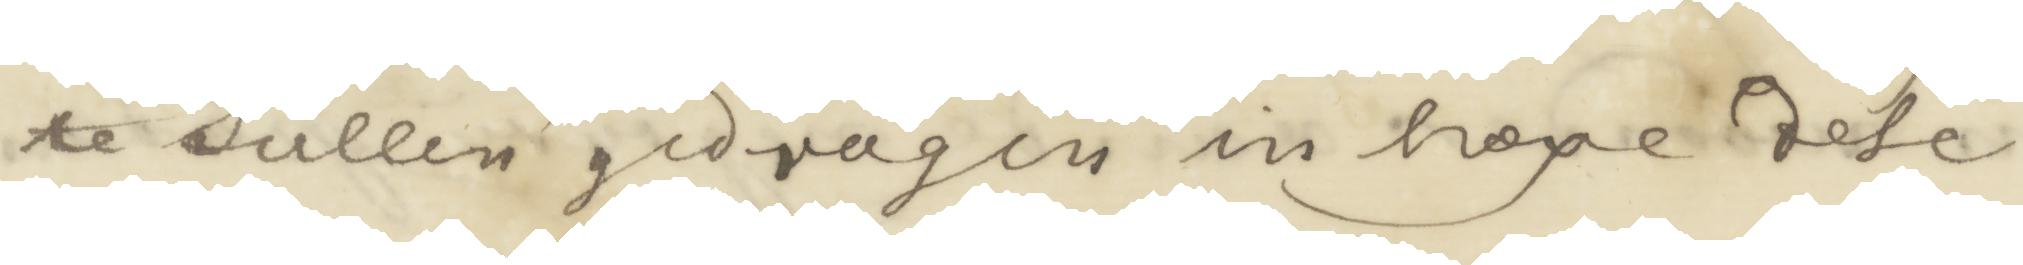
te sullen gedragen in hope dese
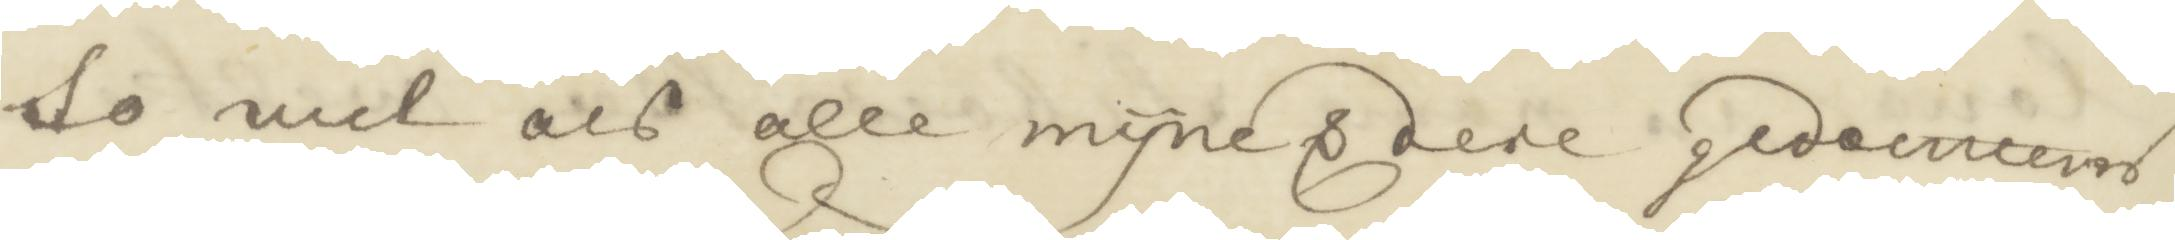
so met als alle mijne verdere gedoentens
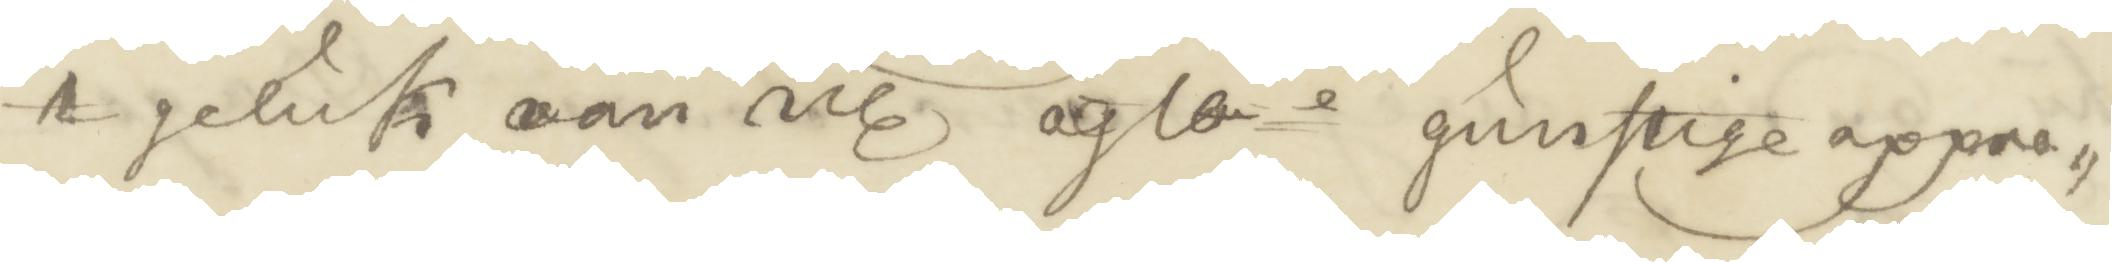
t geluk van uE agtb=e gunstige appro„
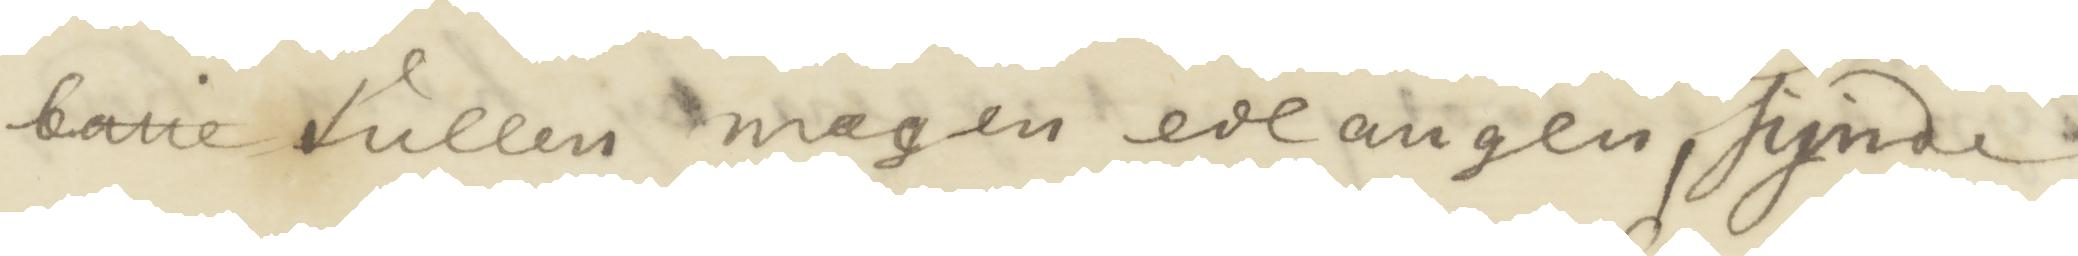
batie sullen mogen erlangen, sijnde
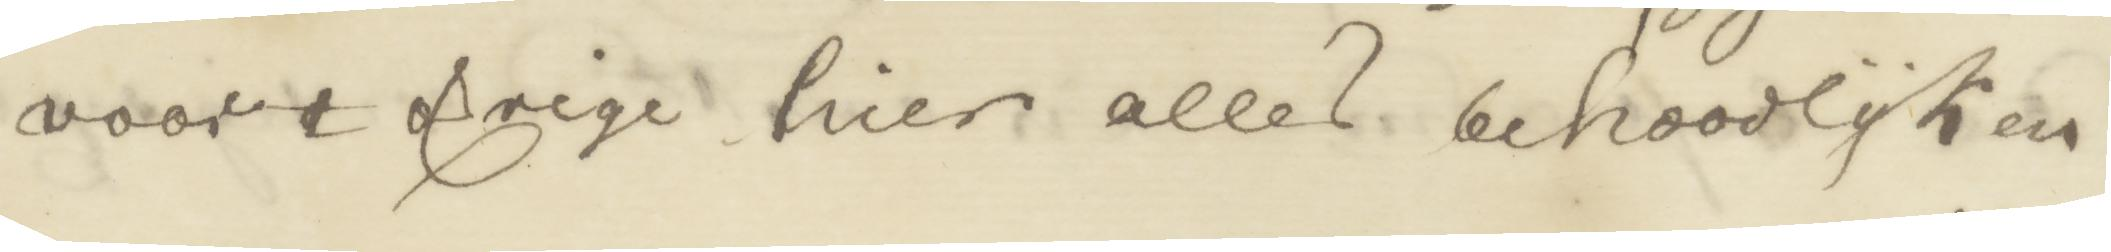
voor t overrige hier alles behoorlijk en
